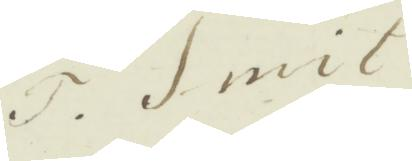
T. Smit
